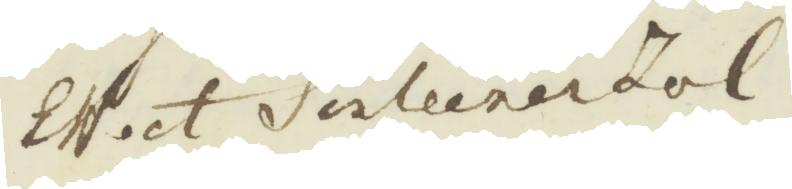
Effect sorteeren zal
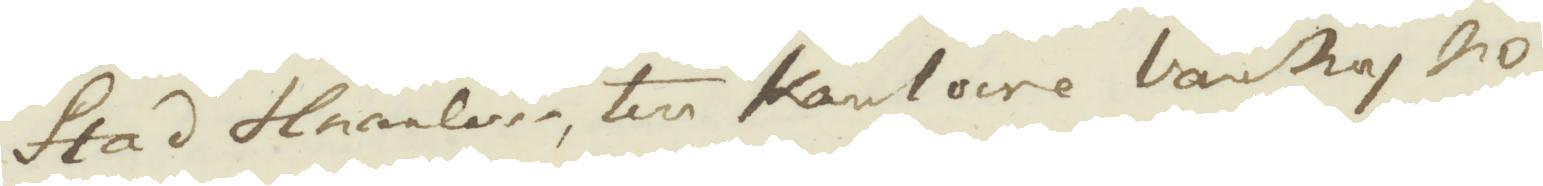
stad Haarlem, ten kantoore van my no
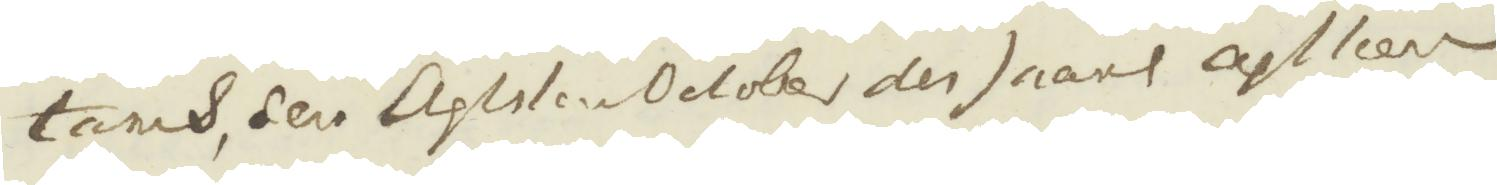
taris, den Agtsten October des Jaars agttien
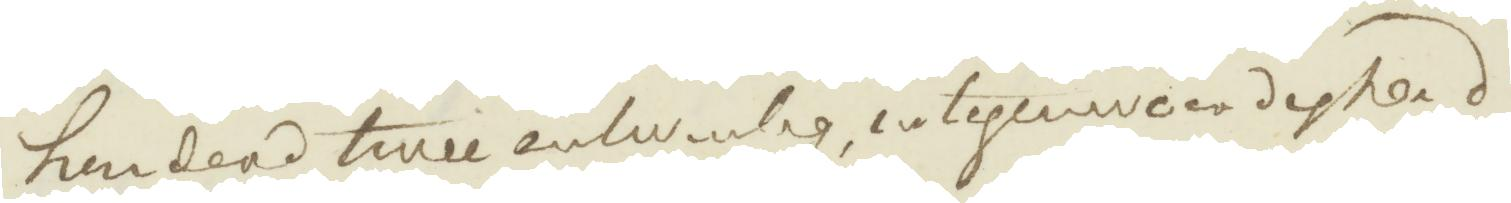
honderd twee en twintig, in tegenwoordigheid
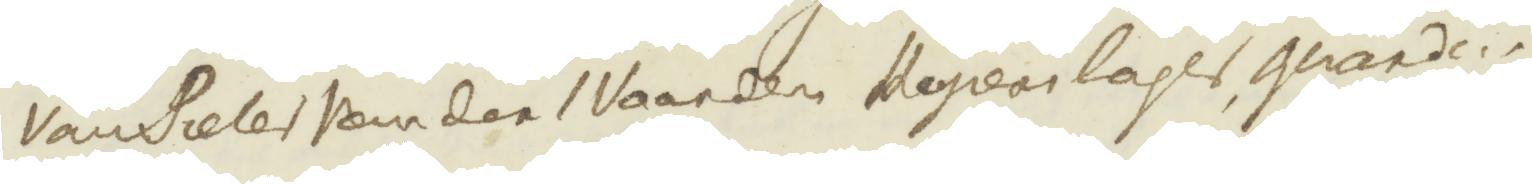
van Pieter van der Waarden koperslager, gerardus
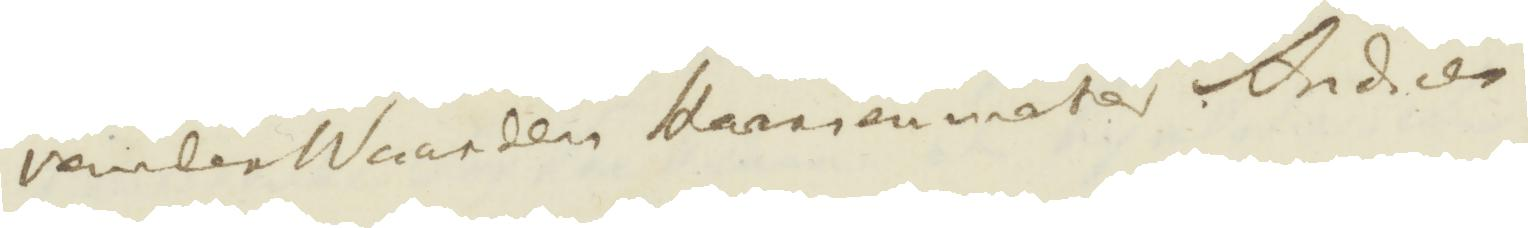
van der Waarden kaarsenmaker, Andries
